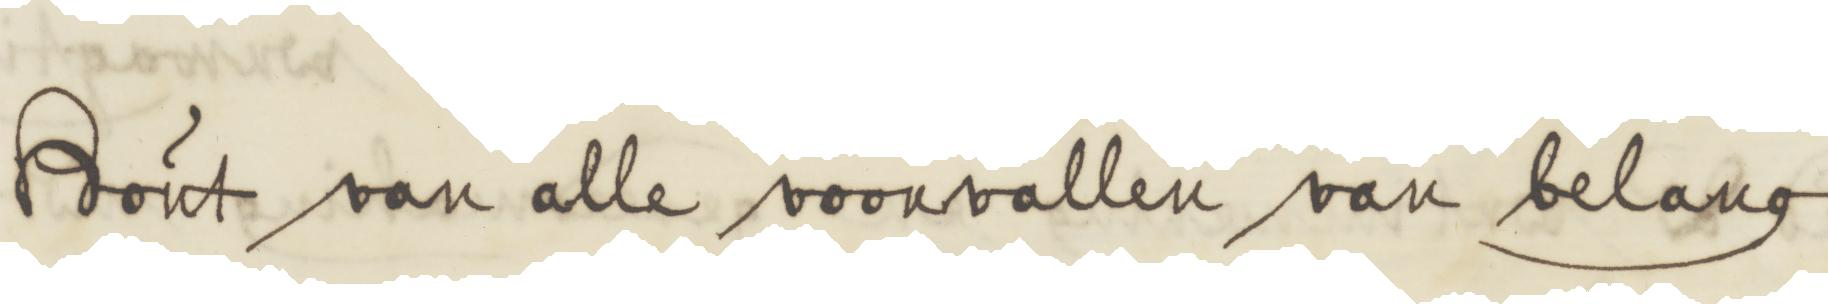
Hout van alle voorvallen van belang
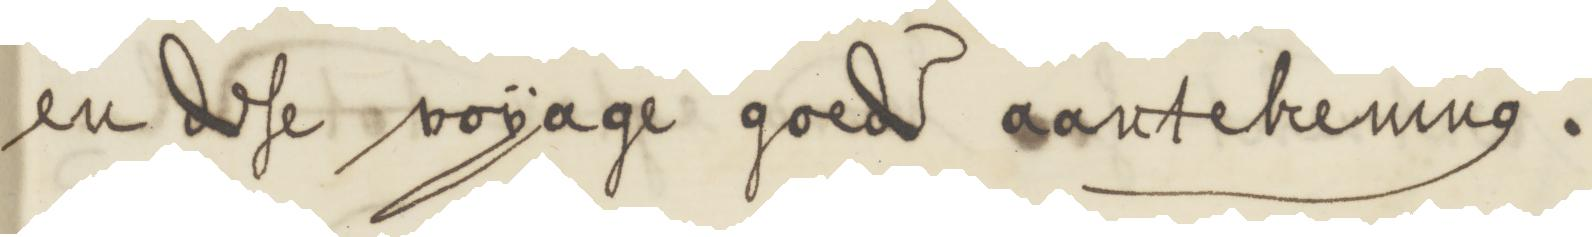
en dese voijage goede aantekening.
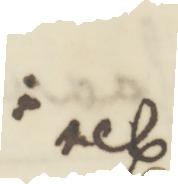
:re
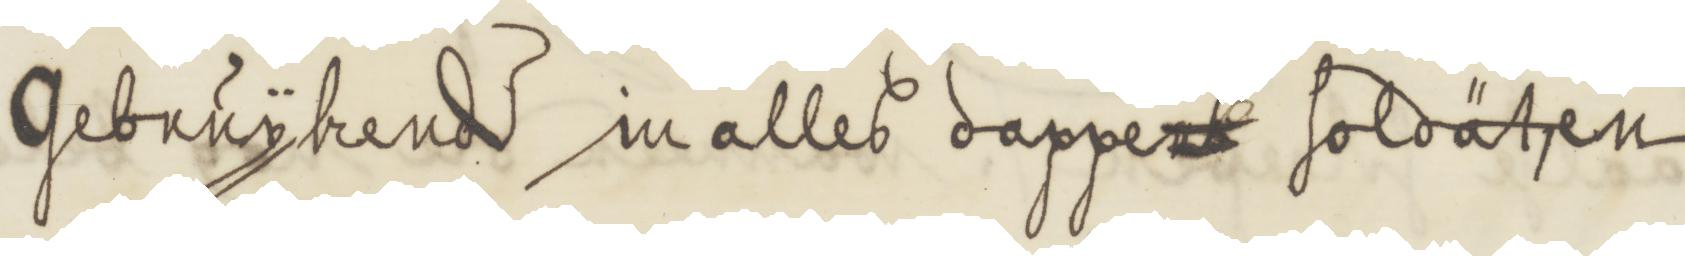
Gebruijkende in alles dappere soldaten
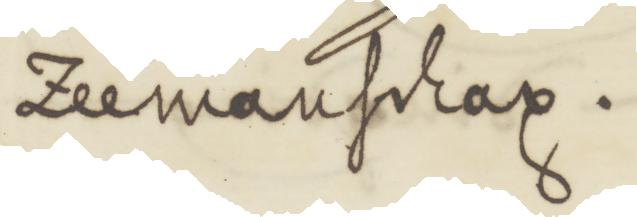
zeemanschap.
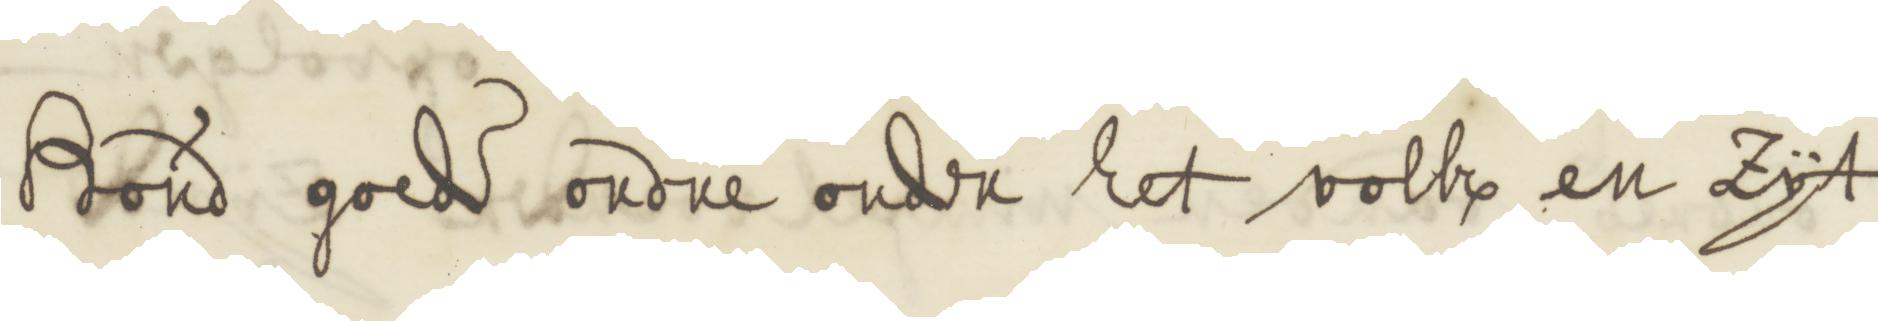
Houd goede ordre onder het volk en zijt
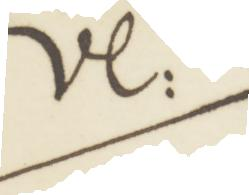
vl:
